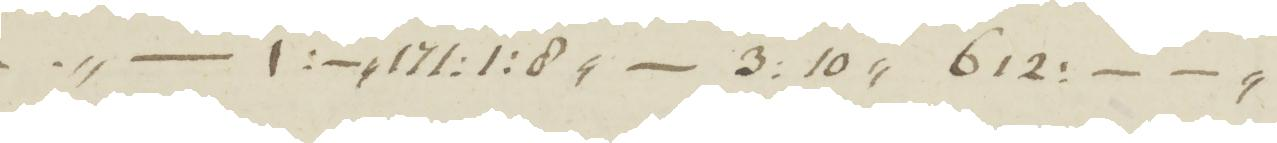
„ —1:—„ 171:1:8„ — 3: 10 „ 612: — —
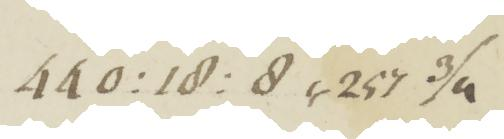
440: 18: 8 „ 257 ¾
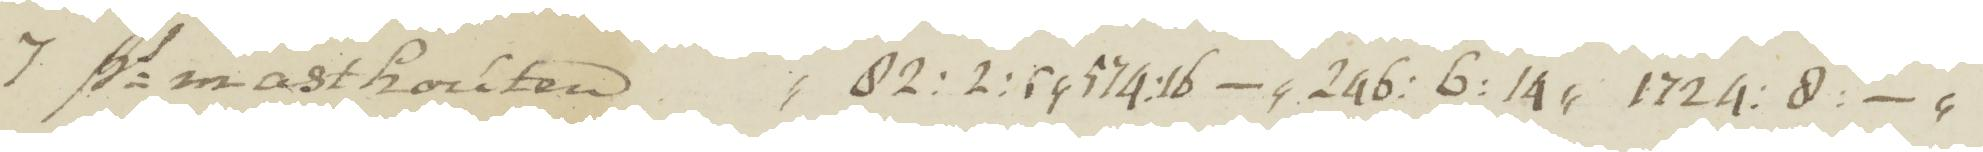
7. p=s masthouten . „ 82:2:5„174:16—.„246:6:14 „ 1724:8:—„
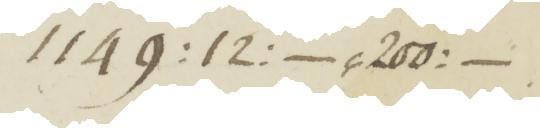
1149:12: —„200: —
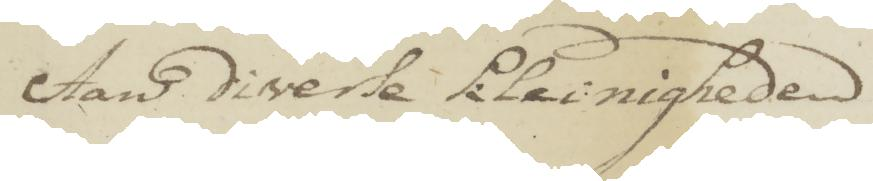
Aan diverse kleinigheden
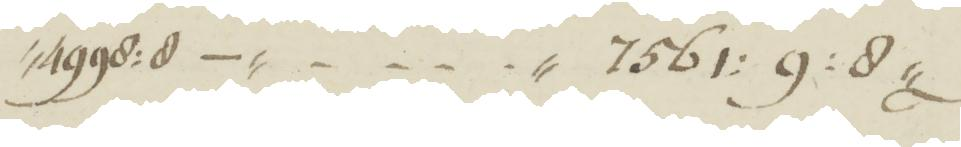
„4998:8 — „ - - - . „ 7561:9:8
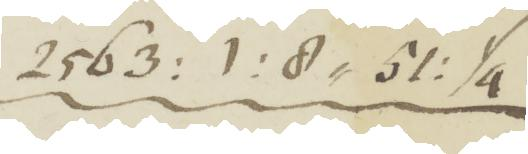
2563: 1: 8 „ 51: ¼
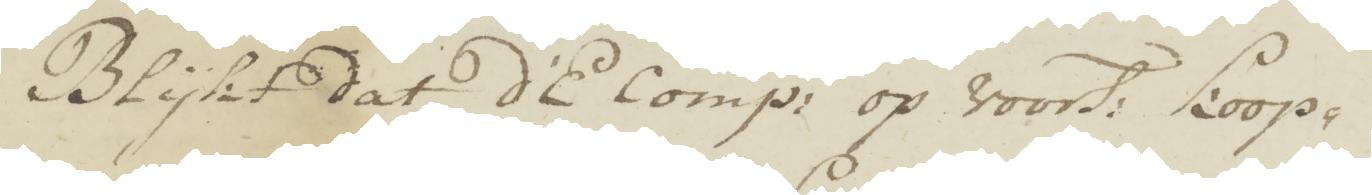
Blijkt dat d’E Comp: op voors: koop„
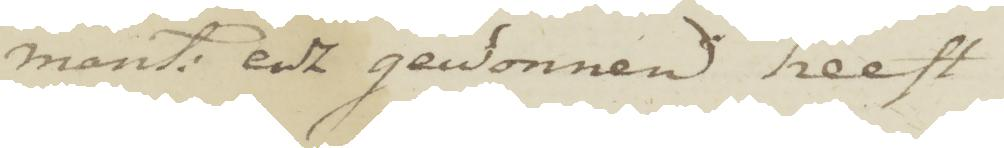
mont: ent gewonnen heeft
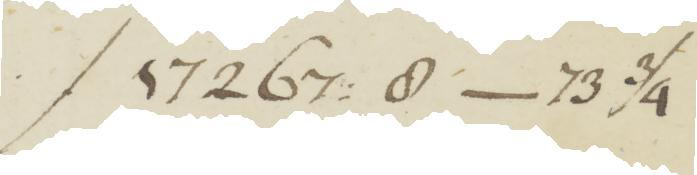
ƒ 17267: 8 —73¾
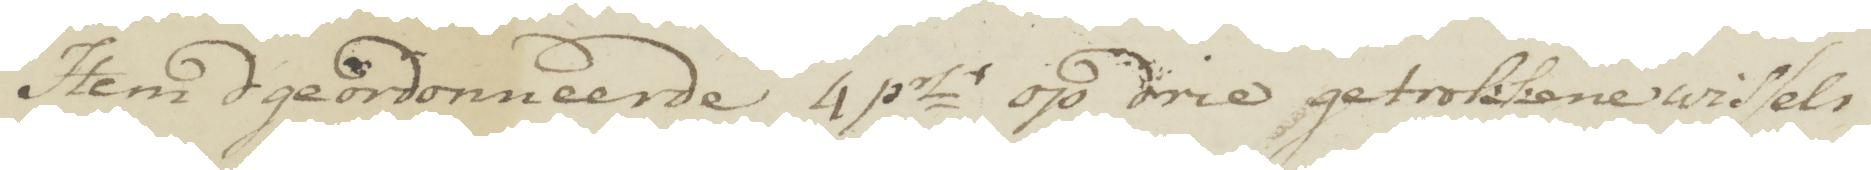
Item d geordonneerde 4 prCt op drie getrokkene wissel
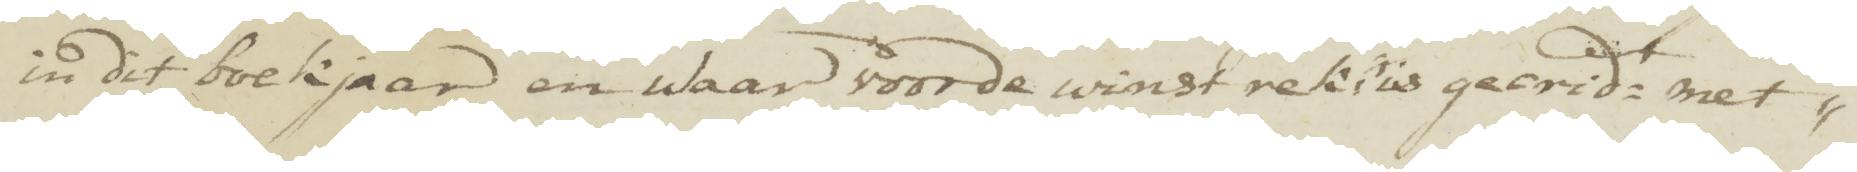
in dit boekjaar en waar voor de winst reksis gecrid=t met„
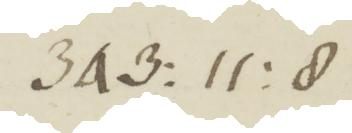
343: 11: 8
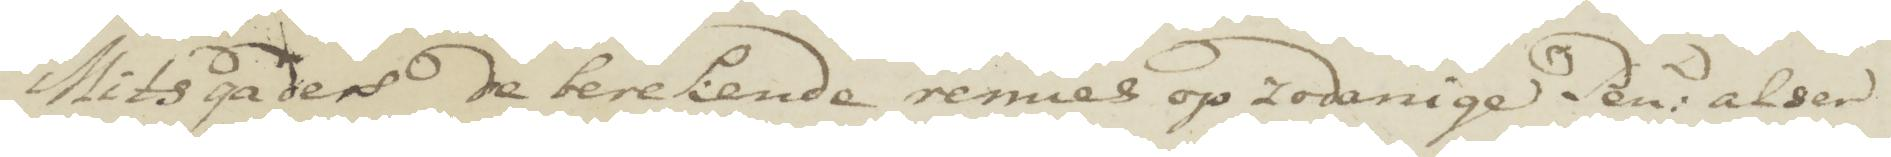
Mitsgaders de berekende remies op zodanige Pen: alser
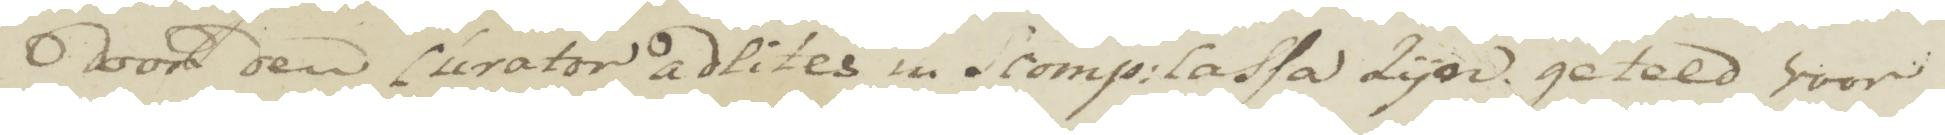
door den Curator ad lites in Scomp: Cassa zijn. geteld voor
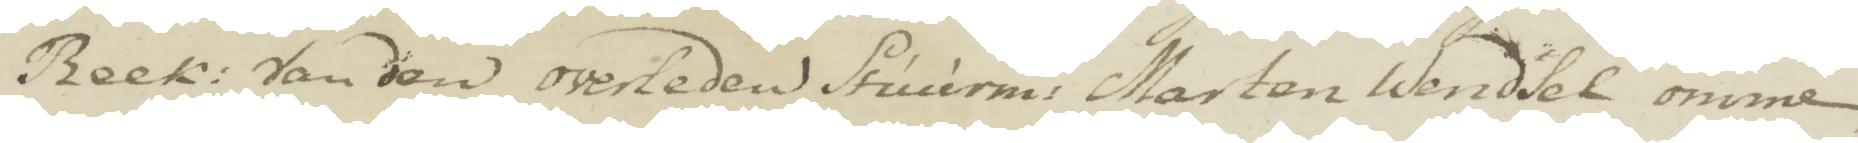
Reek: van den overleden Stuurm: Marten Wendsel omme
